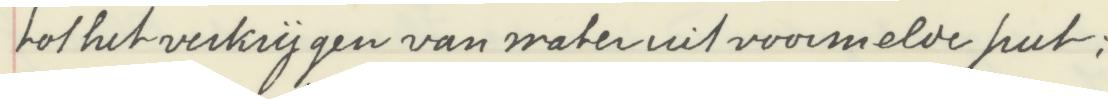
tol het verkrijgen van water uit voormelde put:
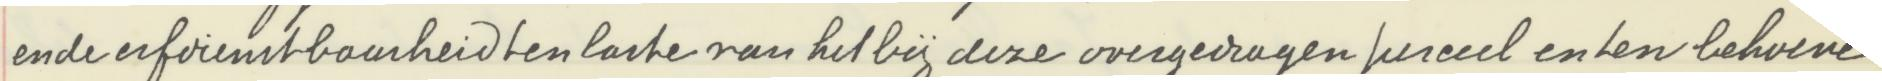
ende erfdienstbaarheid ten laste van het bij deze overgedragen perceel en ten behoeve
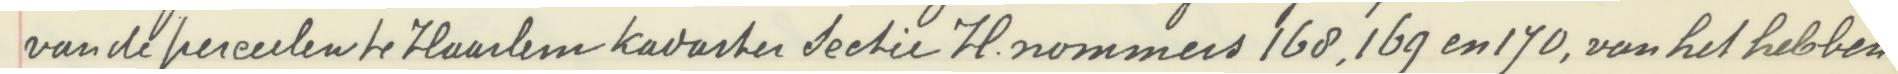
van de perceelen te Haarlem kadaster sectie H. nommers 168, 169 en 170, van het hebben
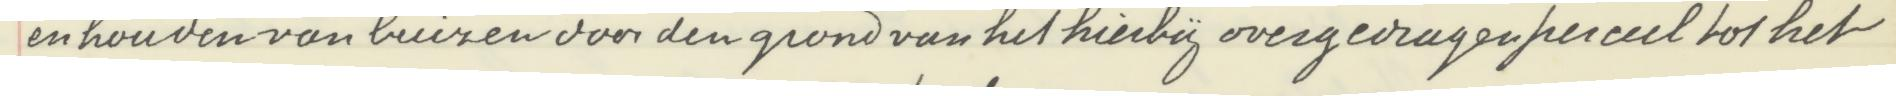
en houden van buizen door den grond van het hierbij overgedragen perceel tot het
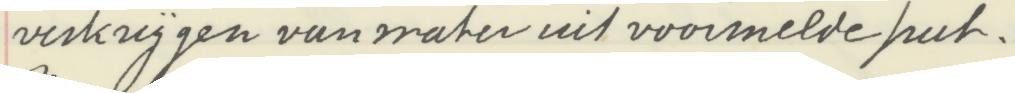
verkrijgen van water uit voormelde put.
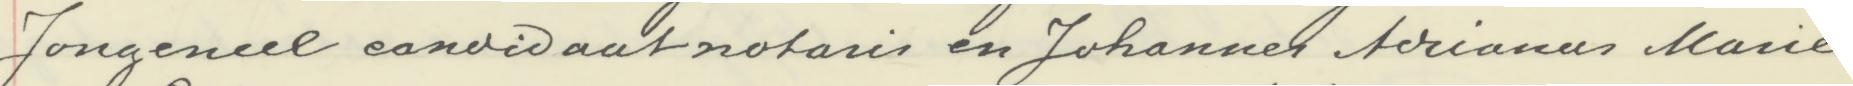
Jongeneel candidaat notaris en Johannes Adrianus Marie
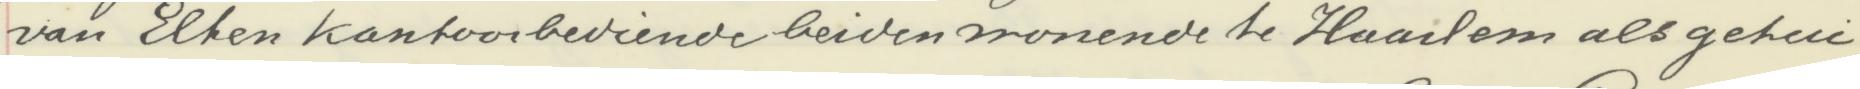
van Elten kantoorbediende beiden wonende te Haarlem als getui
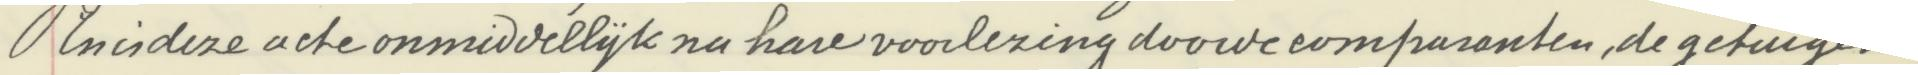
en is deze acte onmiddellijk na hare voorlezing doorde comparanten, de getuigen
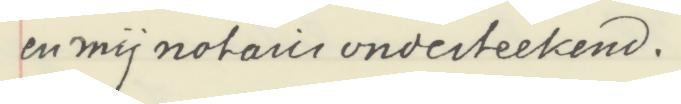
en mij notaris onderteekend.
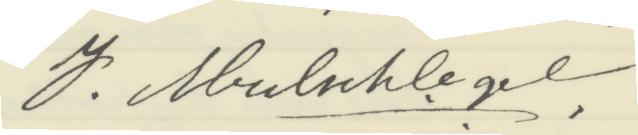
J. Mulschlegel
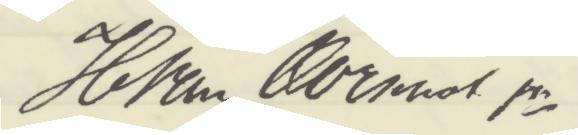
H Van Oorschot j-r
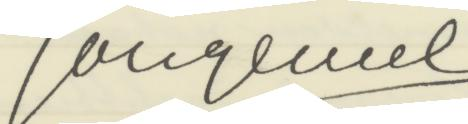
ongeneel
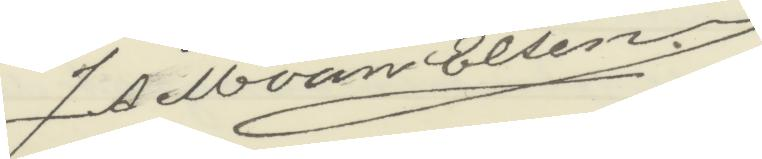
JdvoawEllen
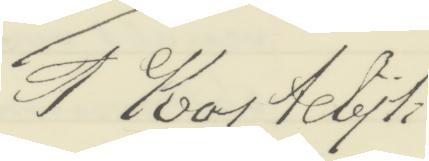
T Kostelijk
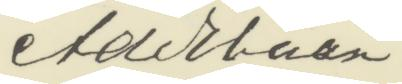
AderHaar
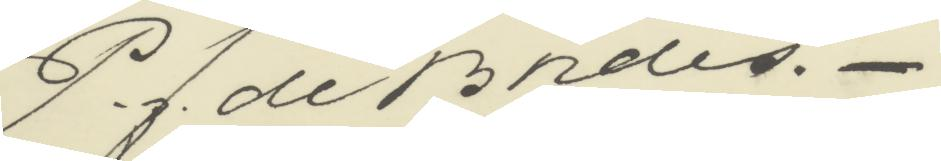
P. f. de Brdes.—
